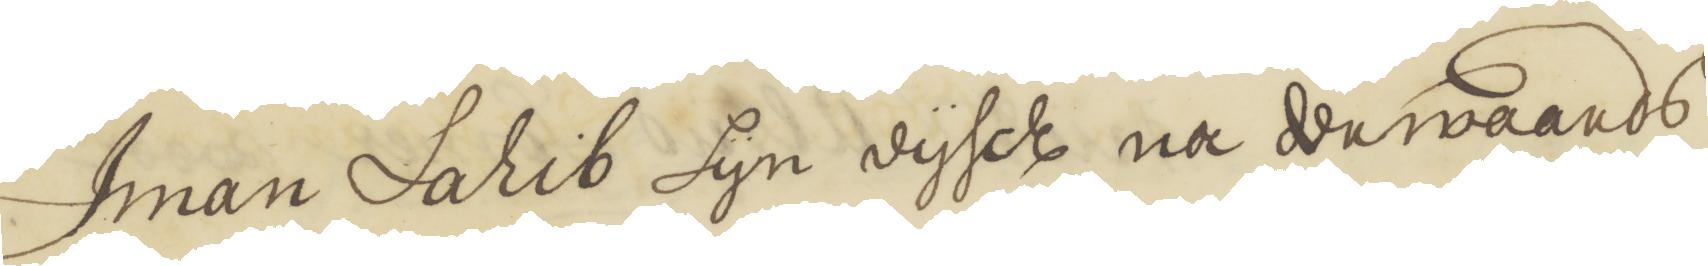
Iman Sahib sijn eijsch na derwaards
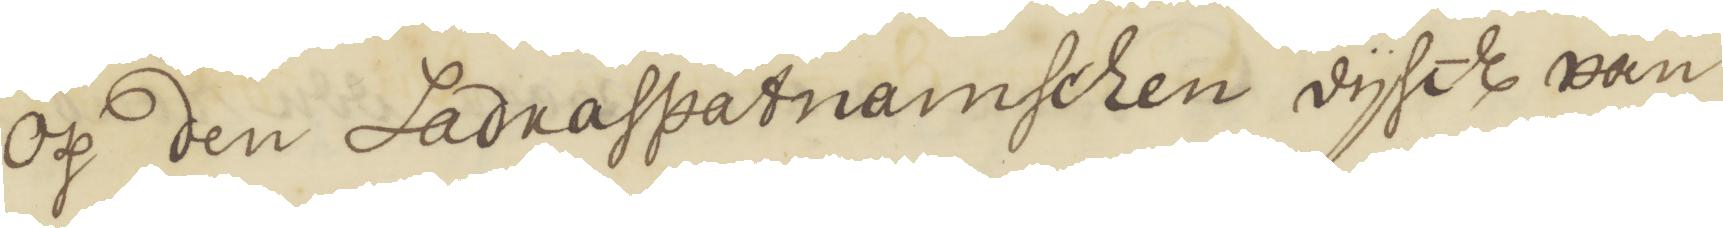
Op den Sadraspatnamschen eijsch van
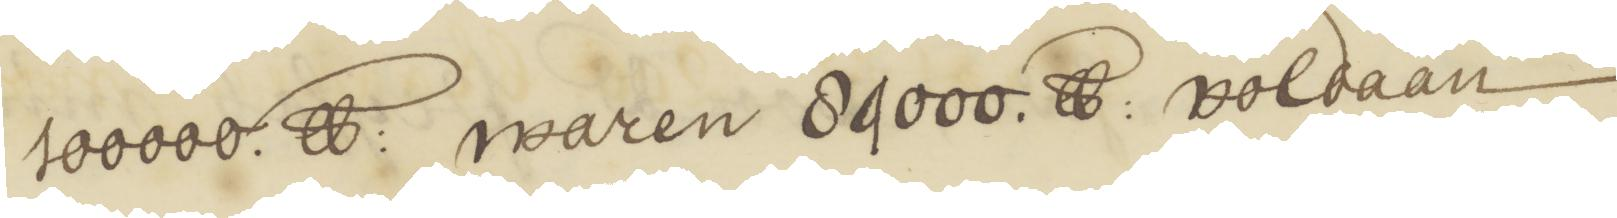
100000. lb: waren 84000. lb: voldaan,
